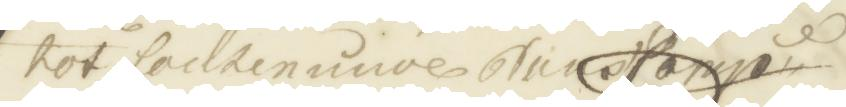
tot locete niuwe van s' Comp„
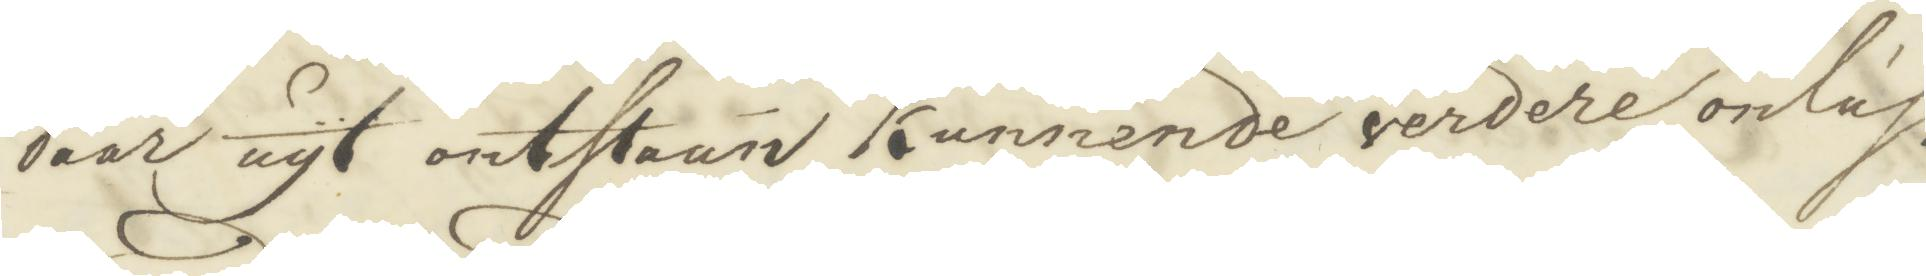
daar uijt ontstaan kunnende verdere onlus„
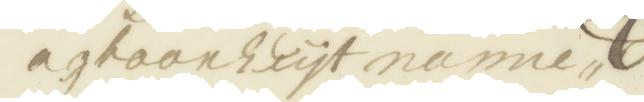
agbaarheijt na mie„
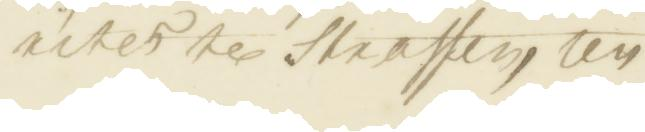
rites te straffen, ten
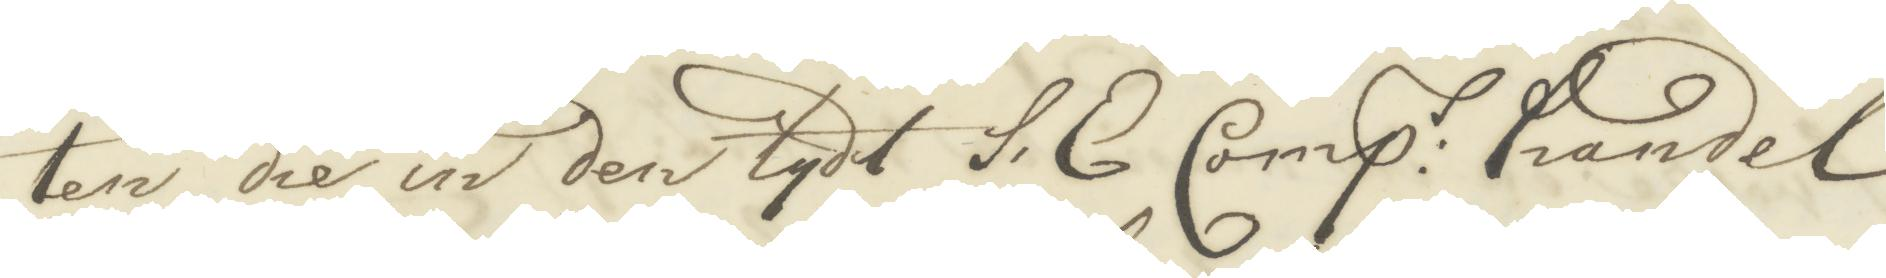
ten, die in den tijdt s' E Comp:s handel
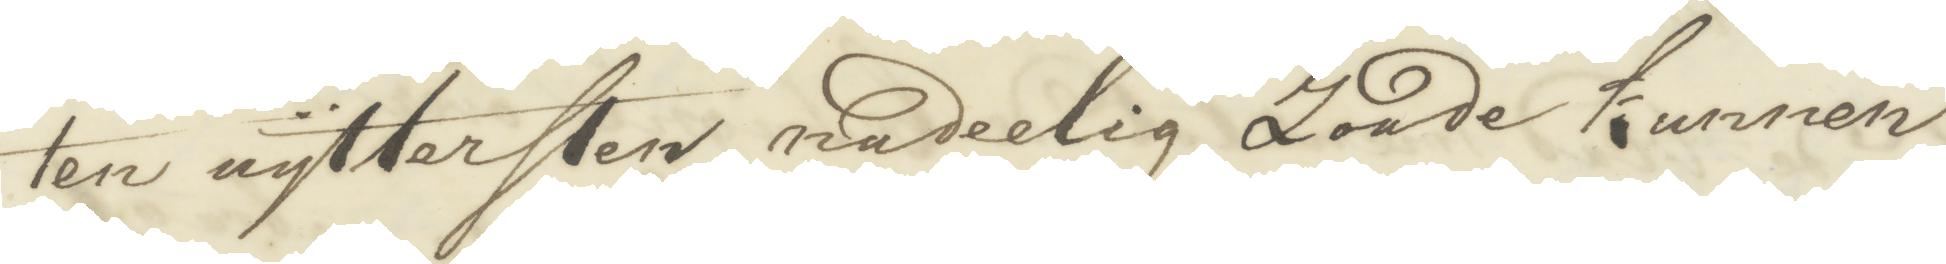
ten uijttersten nadeelig zoude kunnen
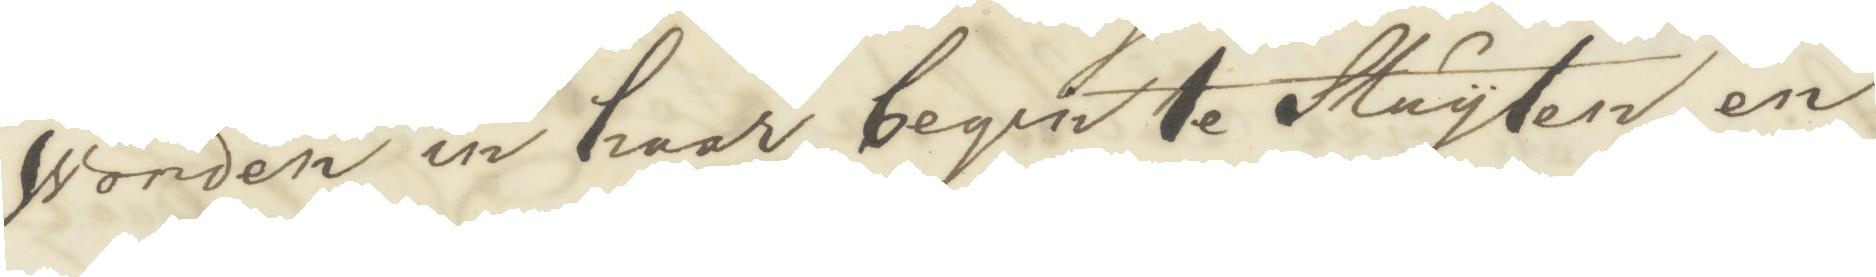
worden, in haer begin te stuijten, en
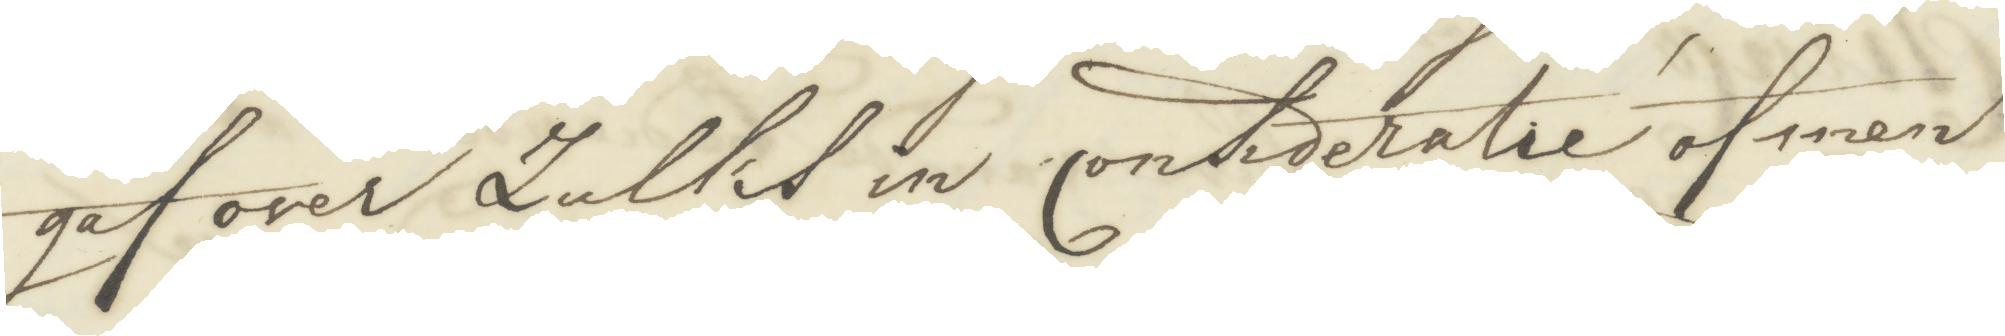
gaf over zulks in consideratie of men
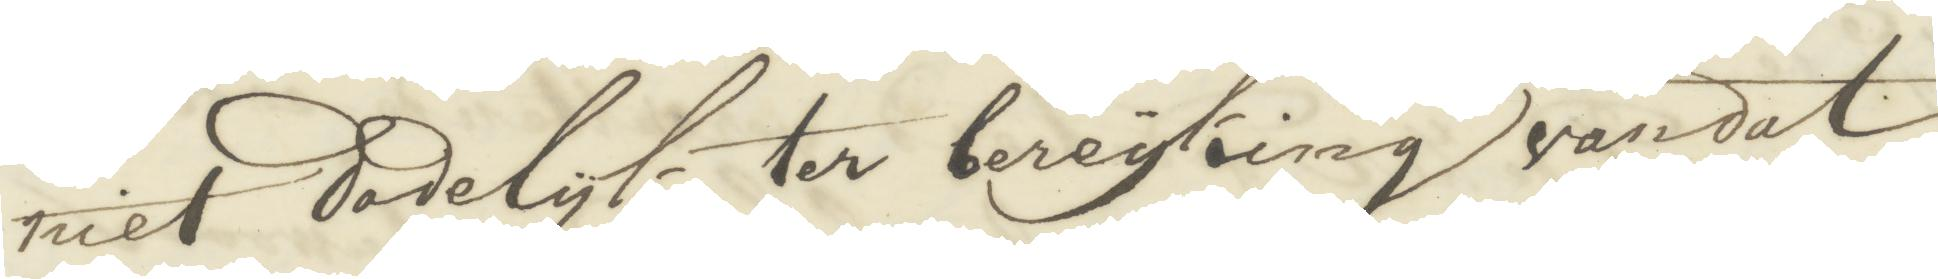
niet dodelijk ter bereijking van dat
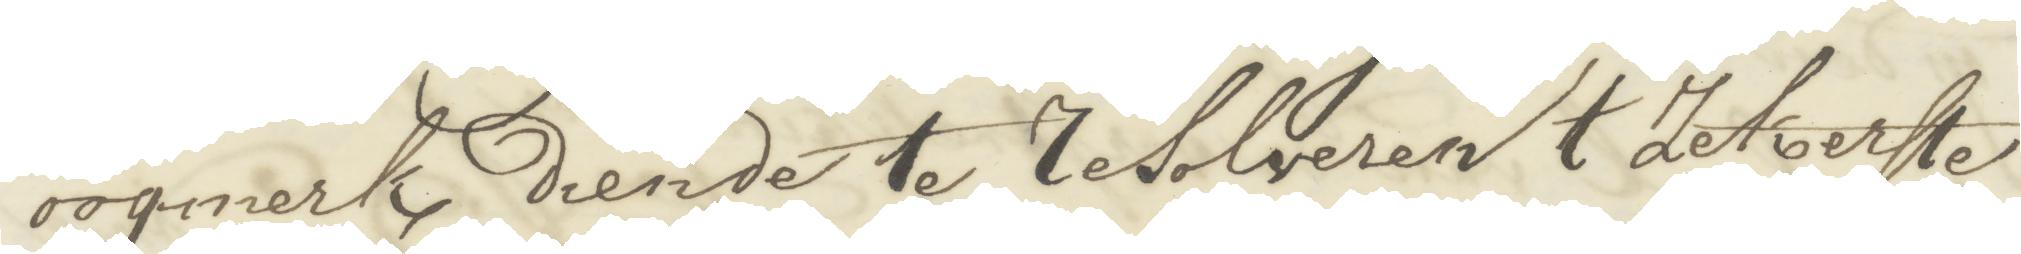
oogmerk, diende te resolveren ’t zekerste
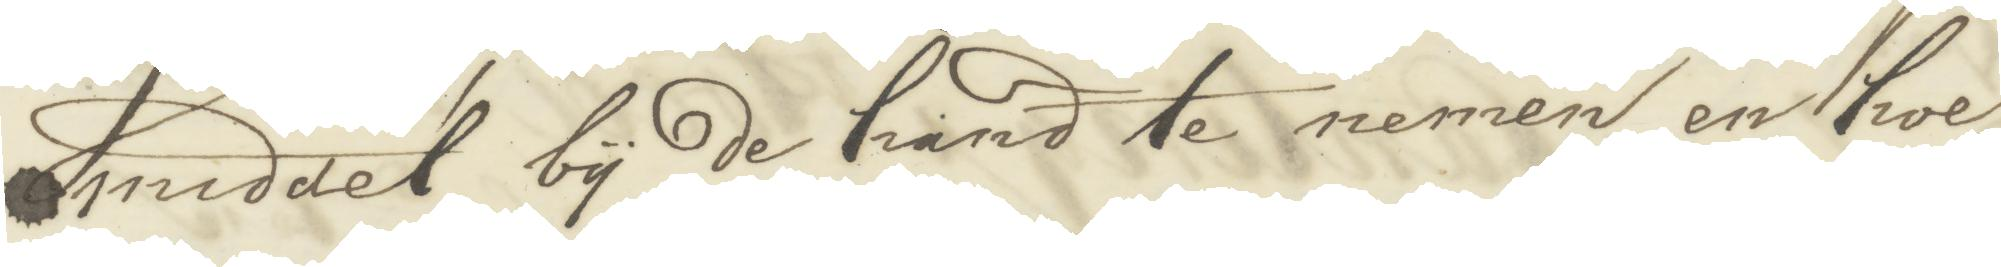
middel bij de hand te nemen, en hoe
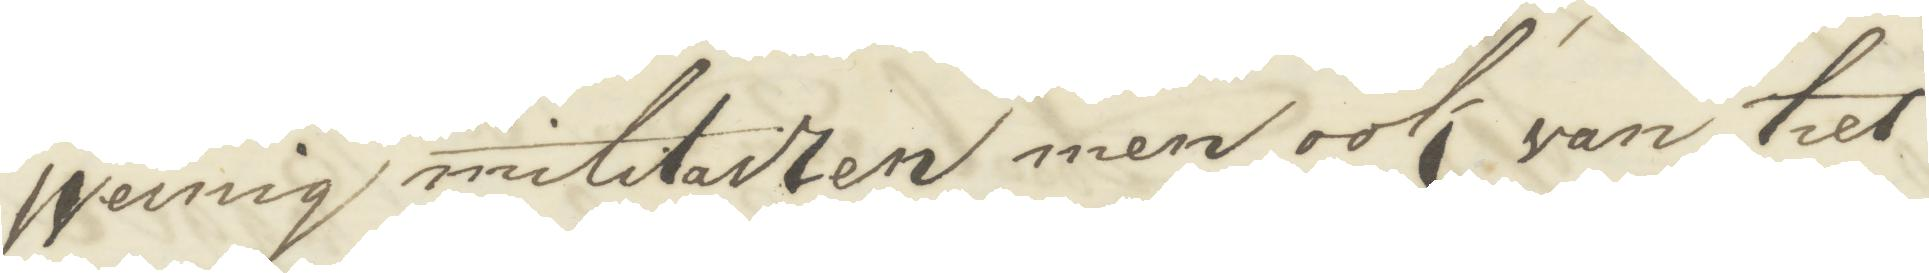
weinig militairen men ook van het
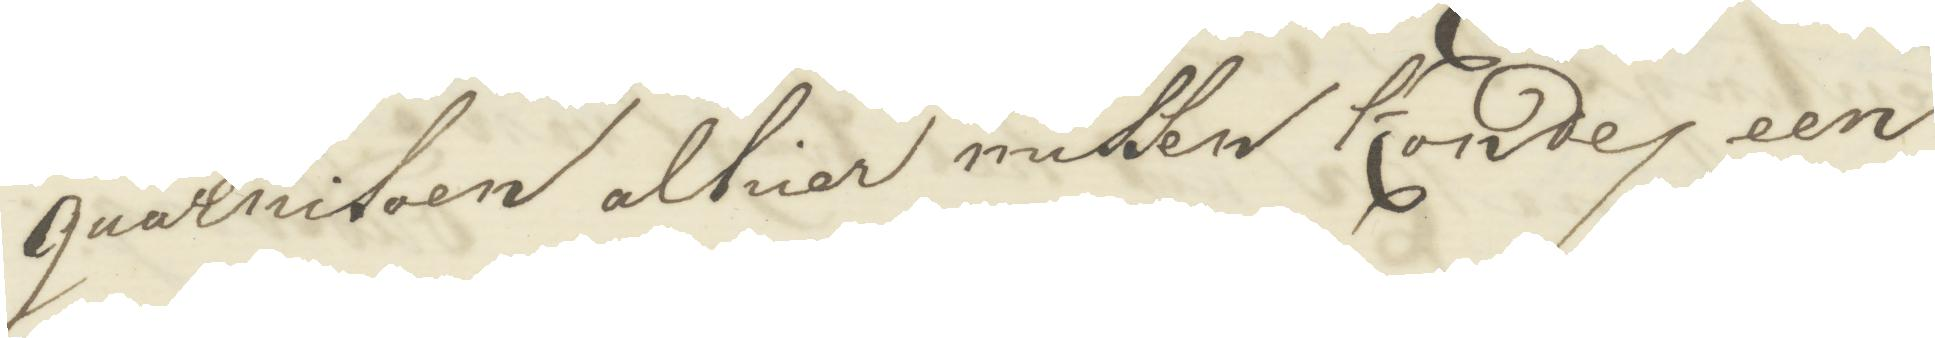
guarnisoen alhier missen konde, een
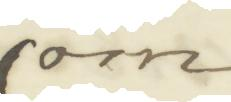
com
